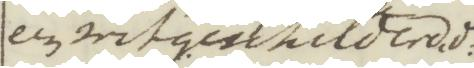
een witgeschilderd d.o
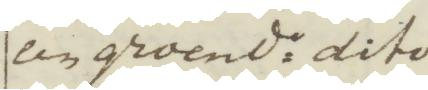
een groen d=o dito
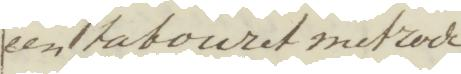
een tabouret met rode
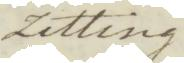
zitting
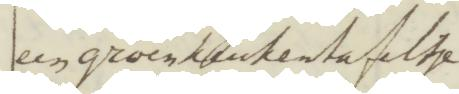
een groen keukentafeltje
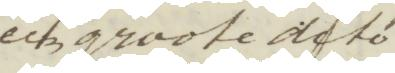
een groote dito
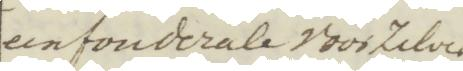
een fouderale voor zilver
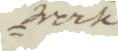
=werk
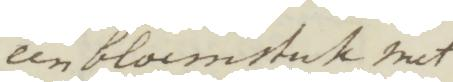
een bloemstuk met
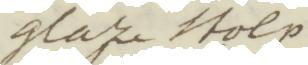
glaze stolp
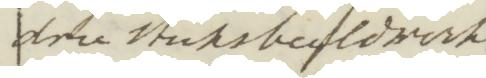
drie stuks beeldwerk
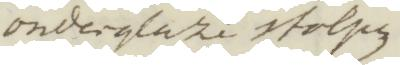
onder glaze stolpen
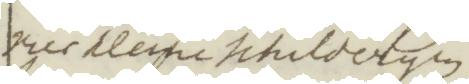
vier kleine schilderyen
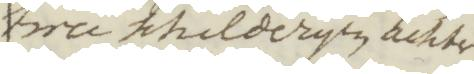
twee schilderyen achte
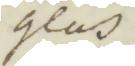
glas
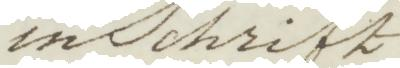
in Schript
